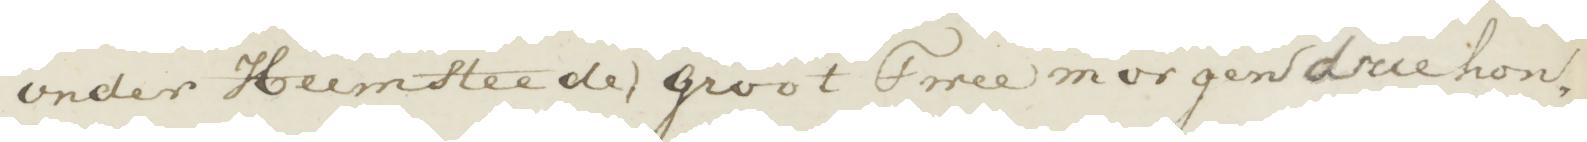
onder Heemsteede) groot Twee morgen drie hon„
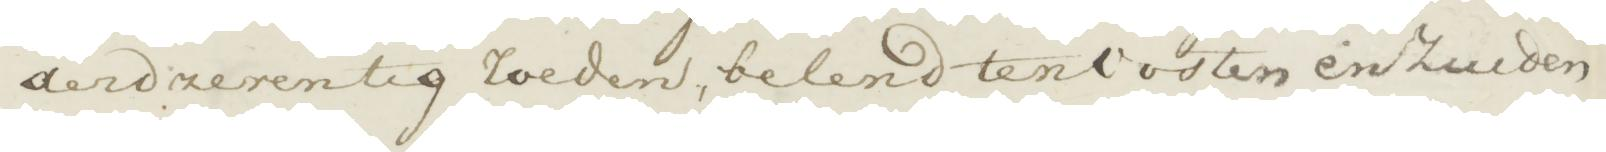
derd zeventig roeden, belend ten Oosten en Zuiden
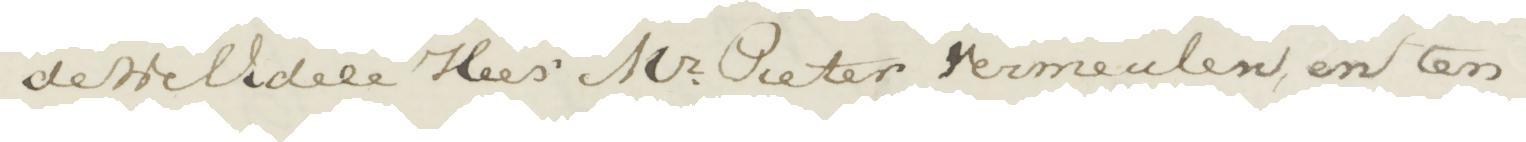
de welk deze Heer M.r Pieter vermeulen en ten
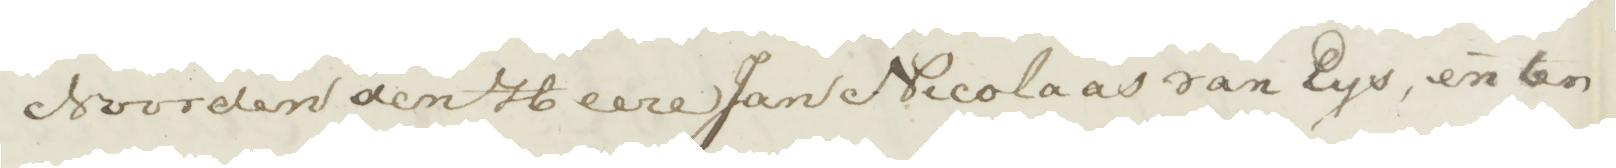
Noorden den Heere Jan Nicolaas van Pys, en ten
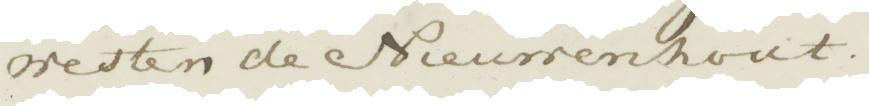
westen de Nieuwenhout.
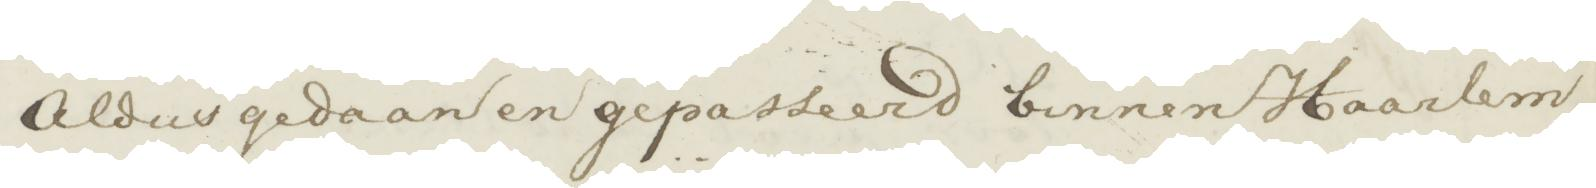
Aldus gedaan en gepasseerd binnen Haarlem,
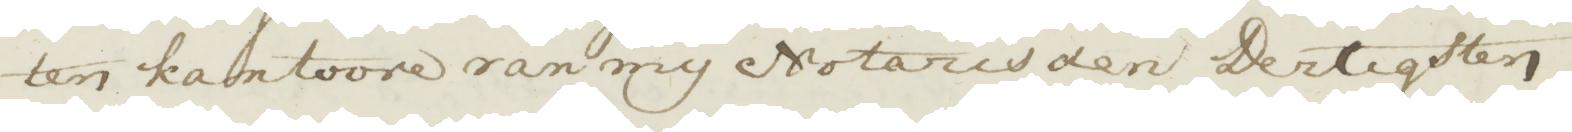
ten kantoore van mij Notaris den Dertigsten
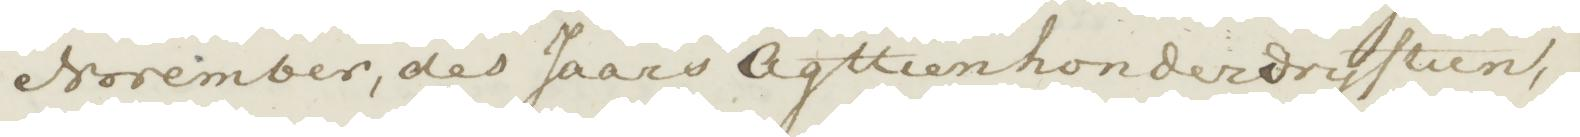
November, des Jaars Agttienhonderdvijftien,
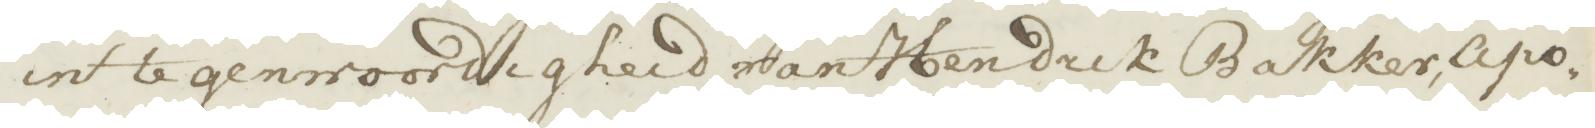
in tegenwoordigheid van Hendrik Bakker, Apo„
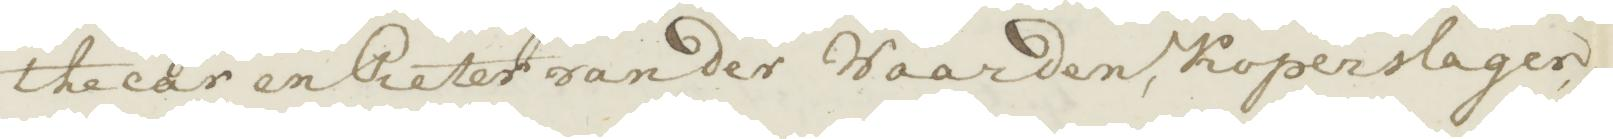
thecar en Pieter van der Waarden, koperslager,
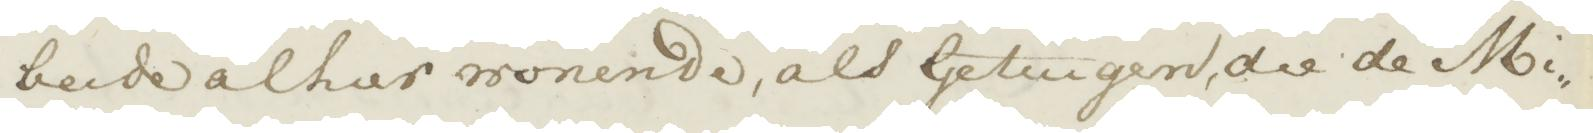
beide alhier wonende, als getuigen, die de Mi„
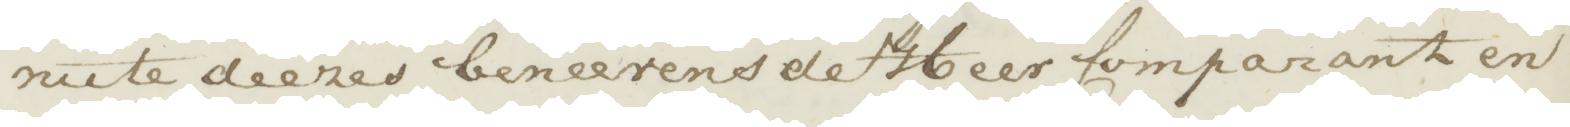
nute deezes beneevens de Heer Comparant en
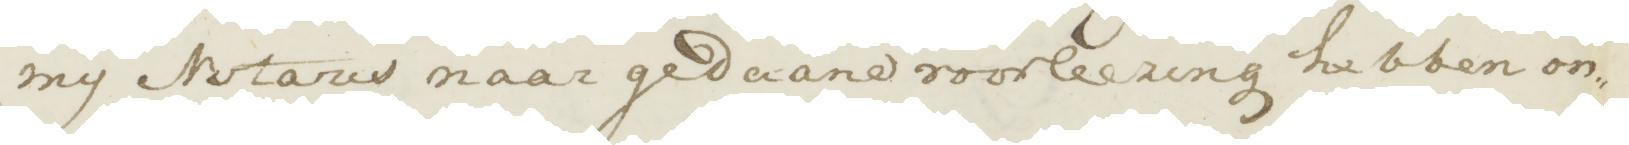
mij Notaris naar gedaane voorleering hebben on„
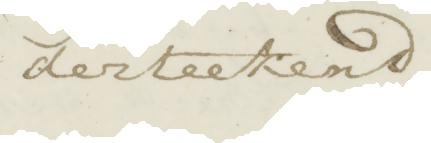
derteekend
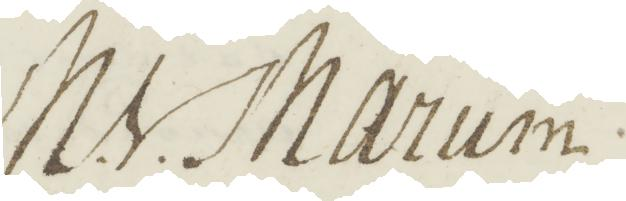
N.V. Marum
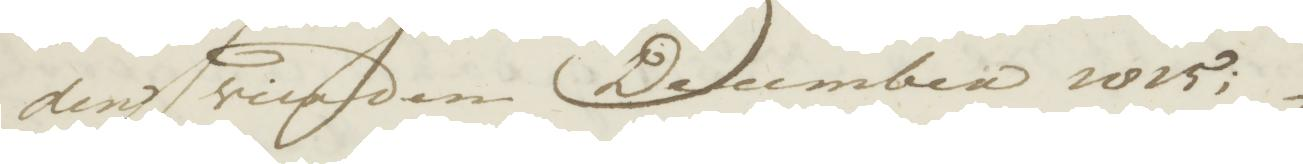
den vierden December 1815;
